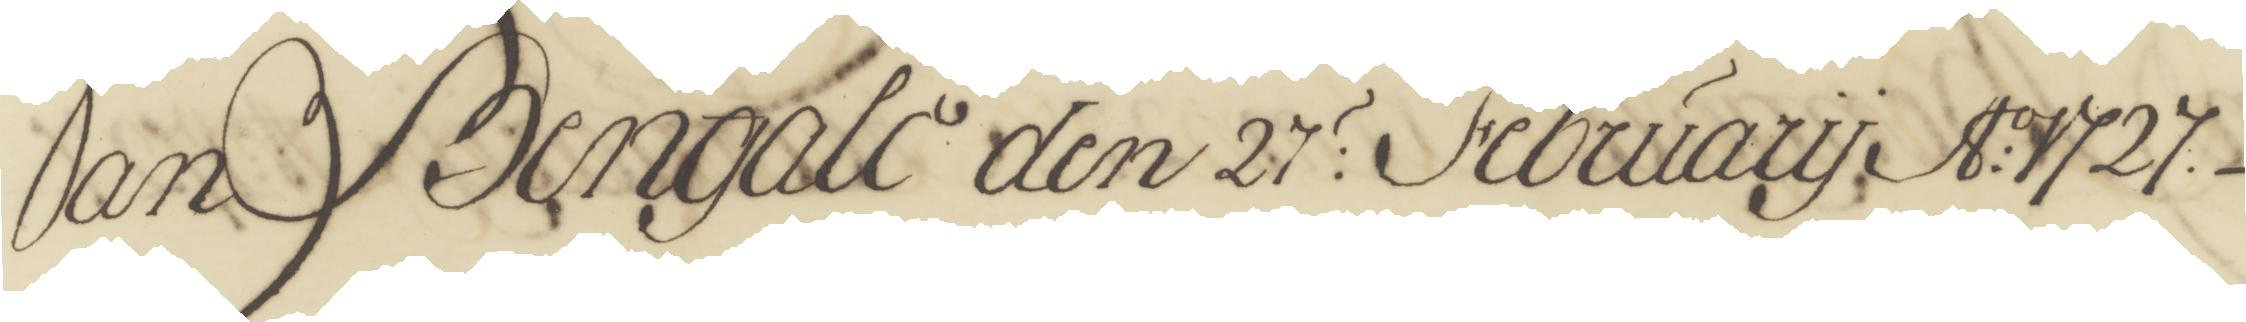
Van Bengale den 27:' Februarij A:o 1727. —
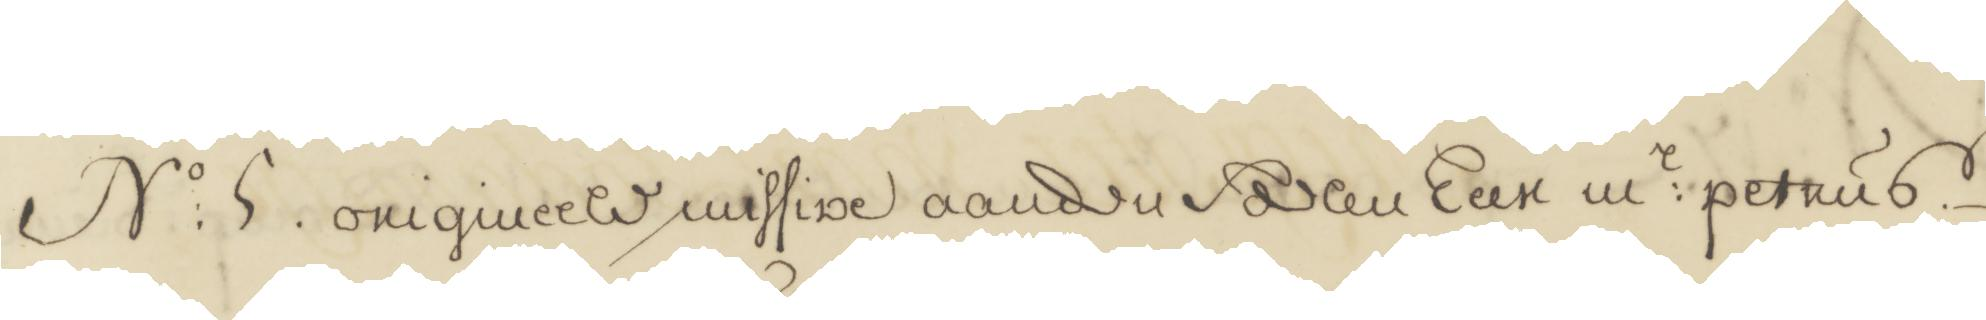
N:o 5. origineele missive aan den Edelen heer m:r petrus. —
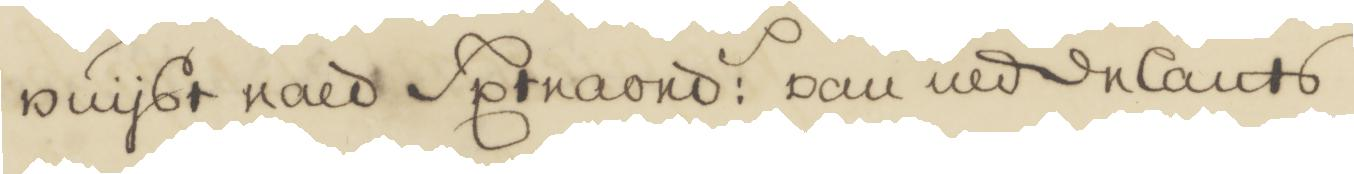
vuijst naed Extraord:s van nederlants
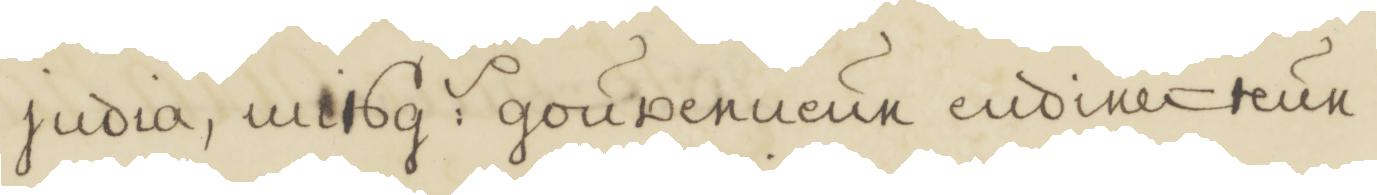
jndia, mitsg:s gouverneur en directeur
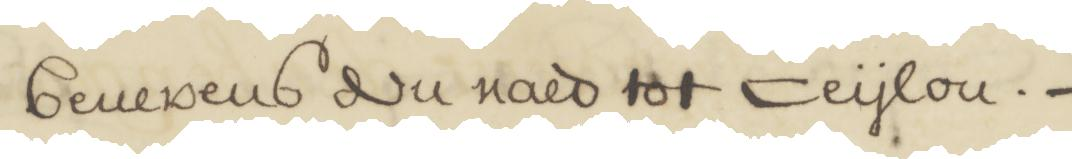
benevens den raed tot Ceijlon. —
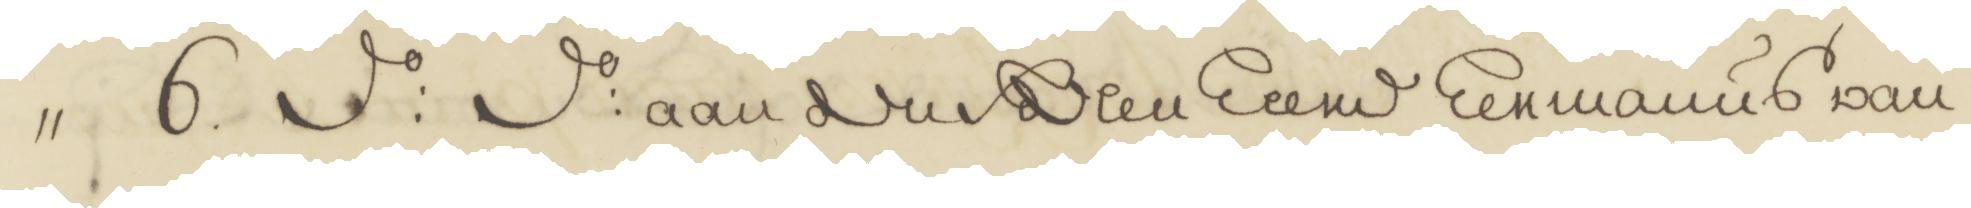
„ 6. D:o D:o aan den Edelen heere hermanus van
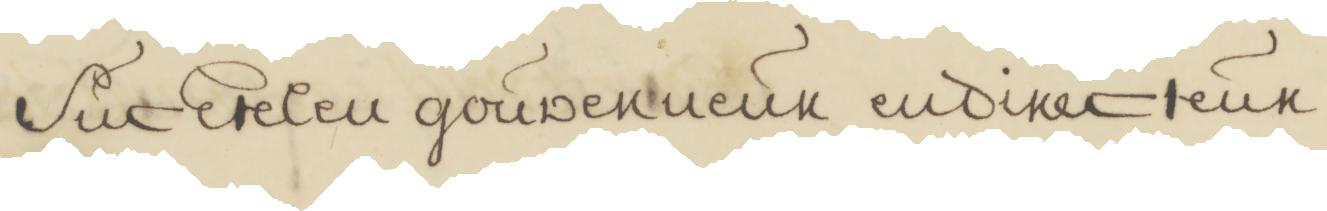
Suchtelen gouverneur en directeur
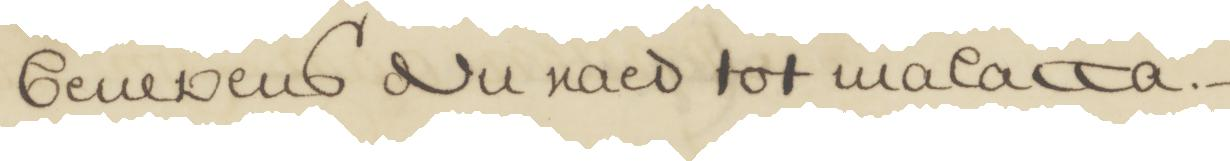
benevens den raed tot malacca. —
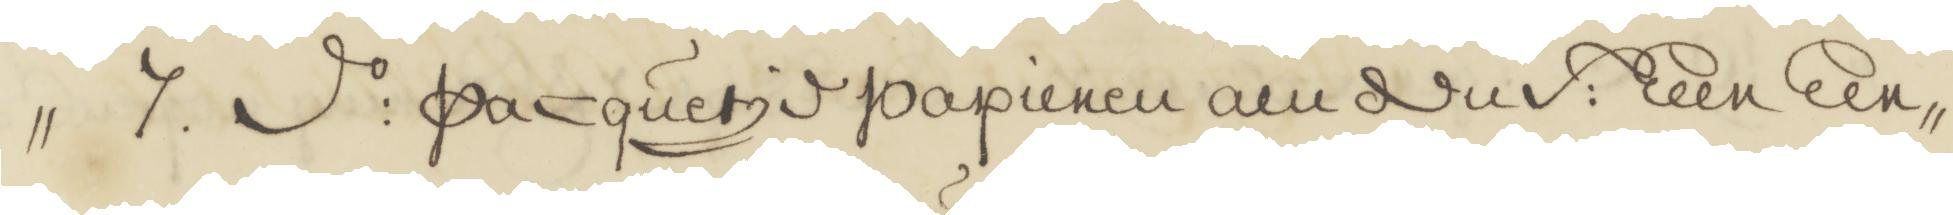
„ 7. D:o pacquetje papieren aen den E: heer her„
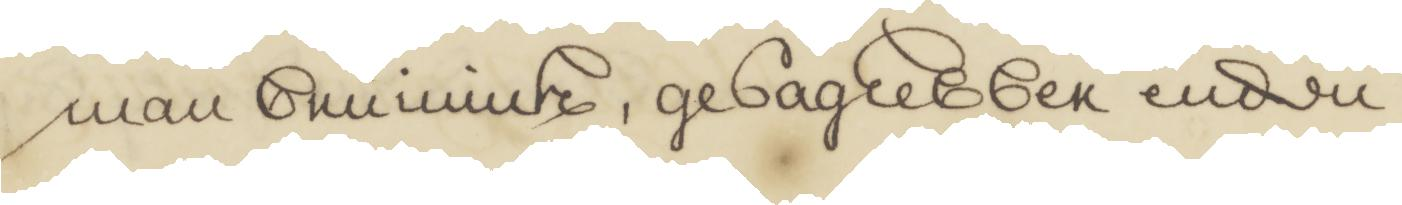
man bruinink, gesaghebber en den
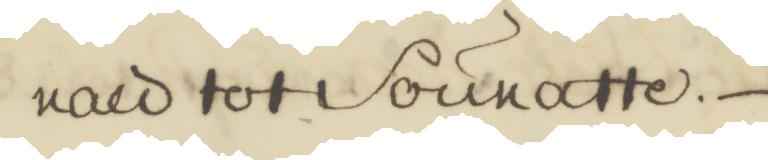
raed tot Souratte. —
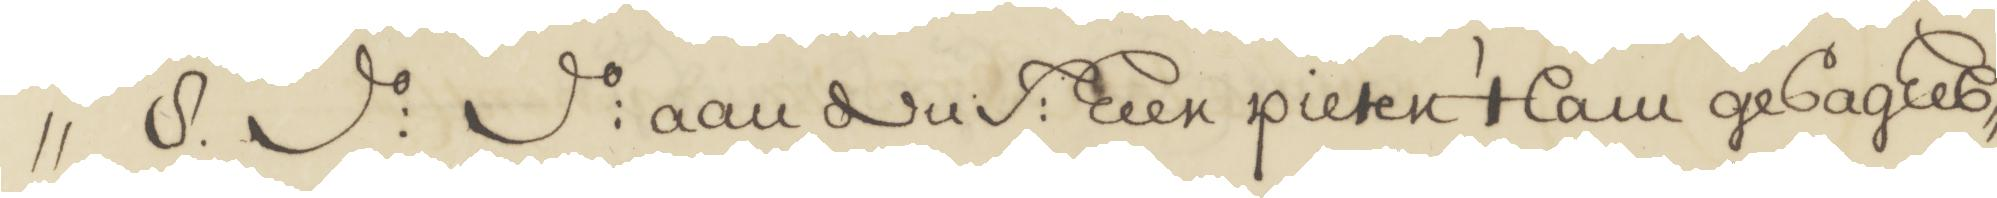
„ 8. D:o D:o aan den E: heer pieter ’t Cam gesagheb„
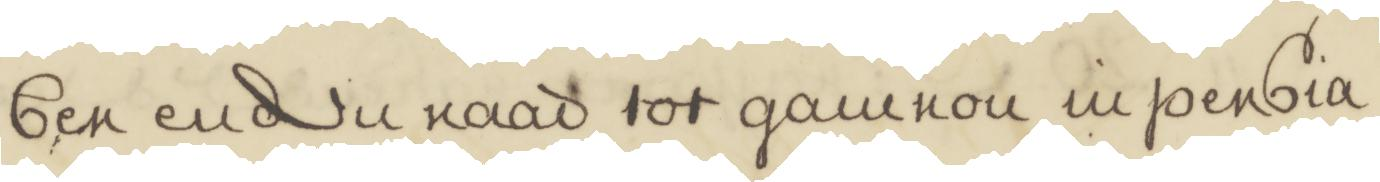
ber en den raad tot gamron in persia
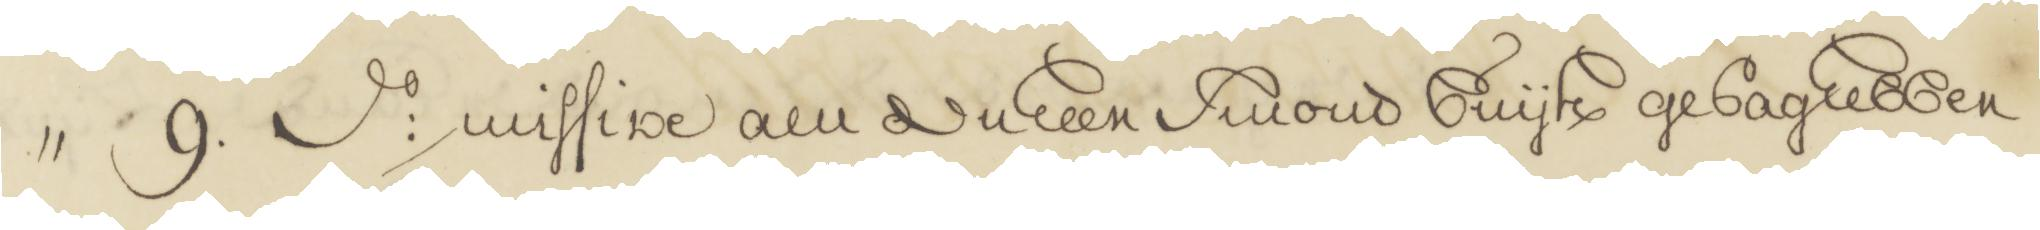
„ 9. D:o missive aen den heer Einond buijk gesaghebber
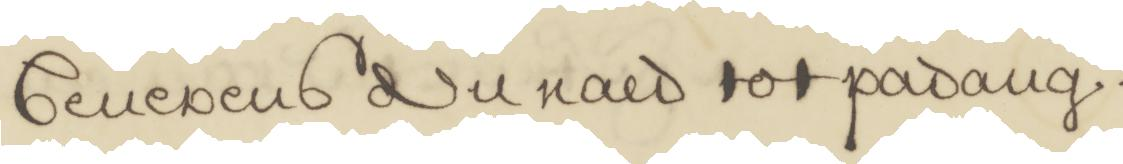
benevens den raed tot padang
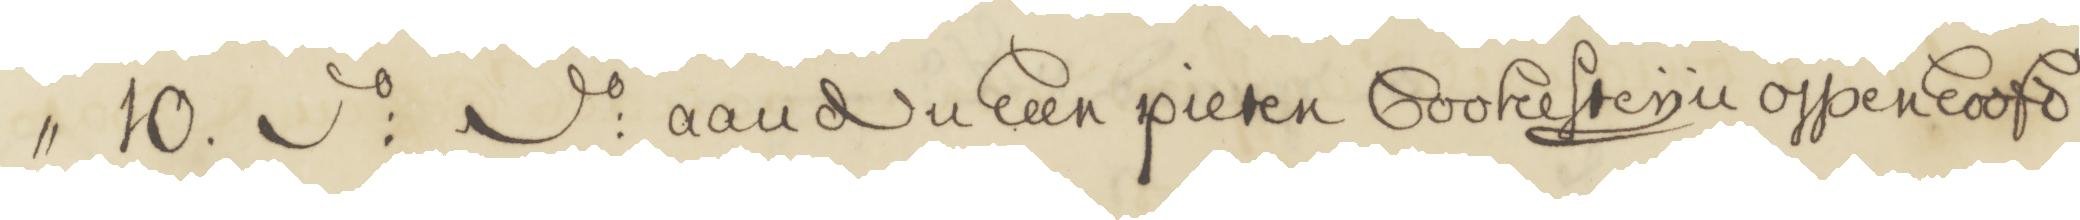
„ 10. D:o D:o aan den heer pieter bookesteijn opperhoofd
